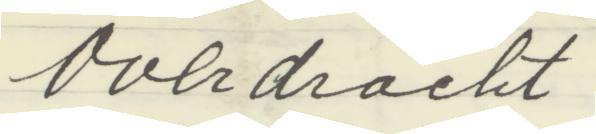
Overdracht
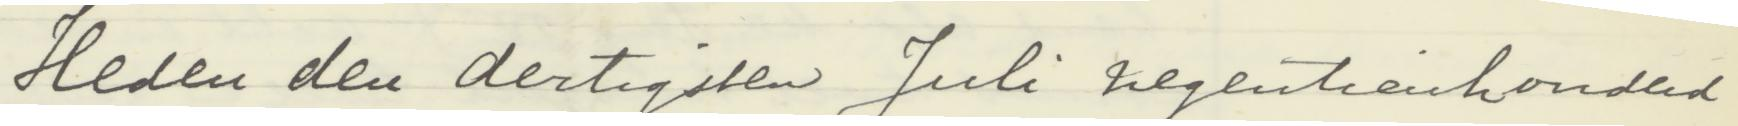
Heden den dertigsten Juli negentienhonderd
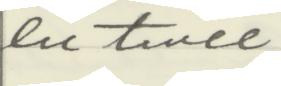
en twee
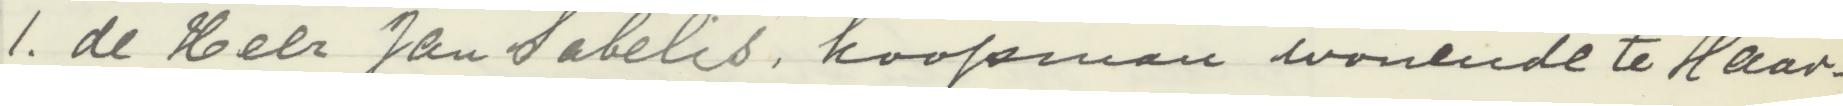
1. de Heer Jan Sabelis, koopman wonende te Haar
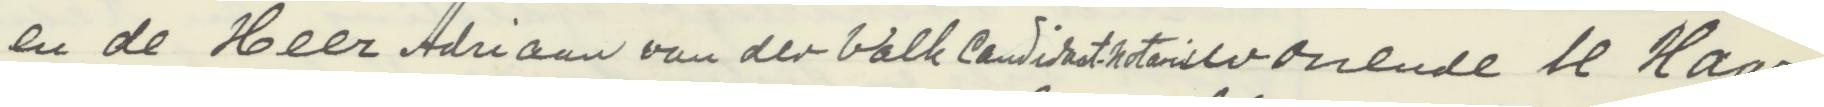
en de Heer Adriaan van der Valk Candidaat-notaris wonende te Haar-
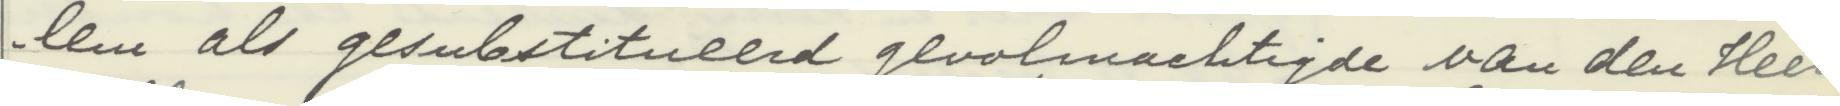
-lem als gesubstitueerd gevolmachtigde van den Heer
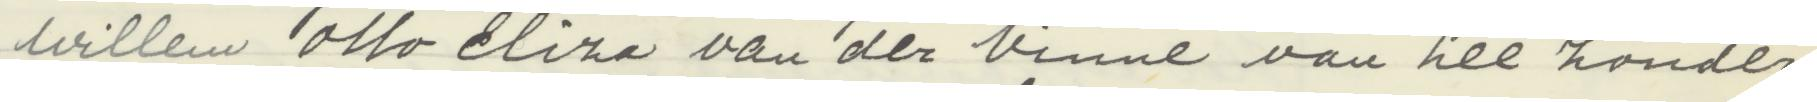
Willem Otto Eliza van der Vinne van Lee zonder
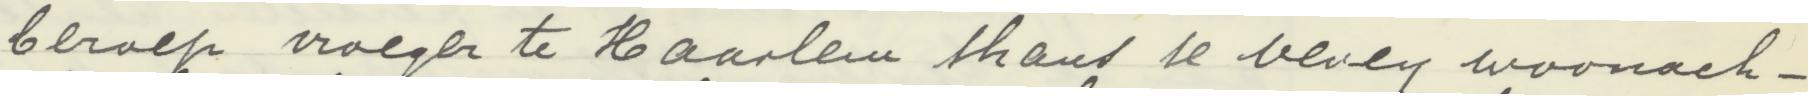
beroep vroeger te Haarlem thans te Vevey woonach-
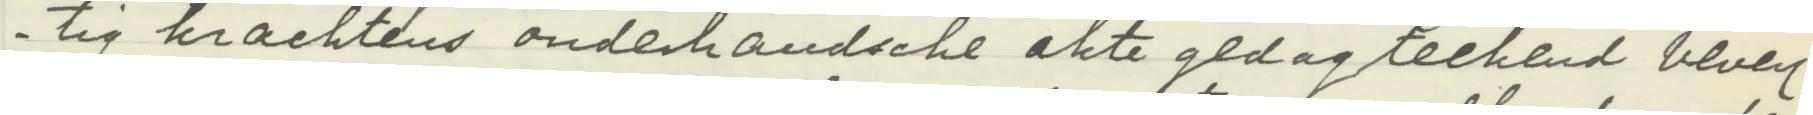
-tig krachtens onderhandsche akte gedagteekend Vevey
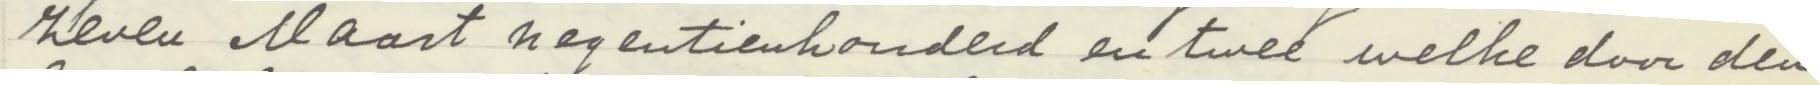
zeven Maart negentienhonderd en twee welke door den
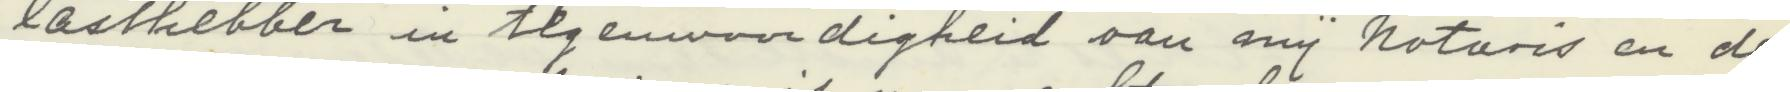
lasthebber in tegenwoordigheid van my notaris en de
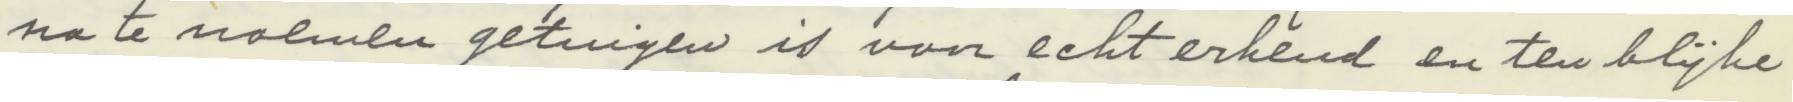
na te noemen getuigen is voor echt erkend en ten blijke
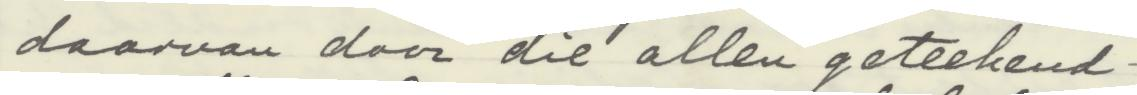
daarvan door die allen geteekend
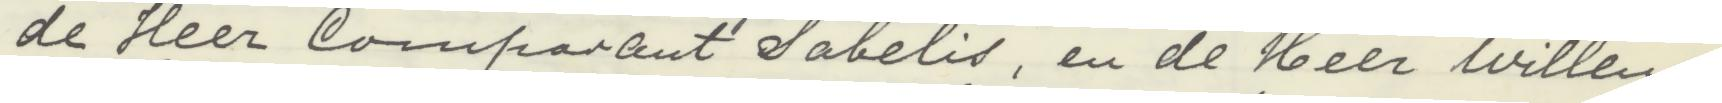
de Heer Comparant Sabelis, en de Heer Willem
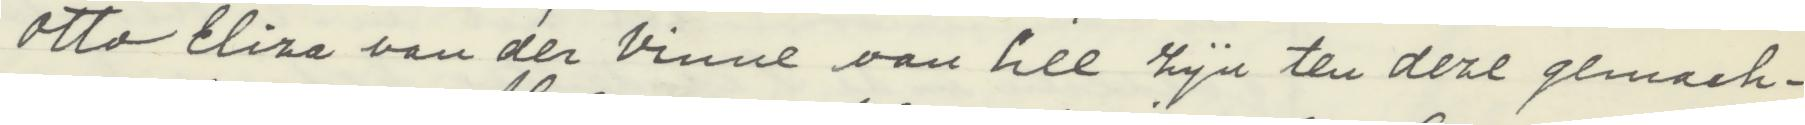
otto Eliza van der Vinne van Lee zijn ten deze gemach-
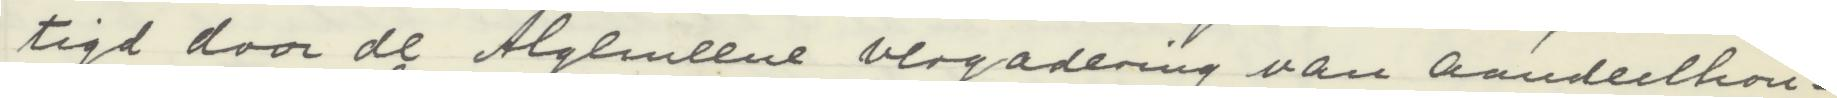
tigd door de Algemeene vergadering van aandeelhou-
